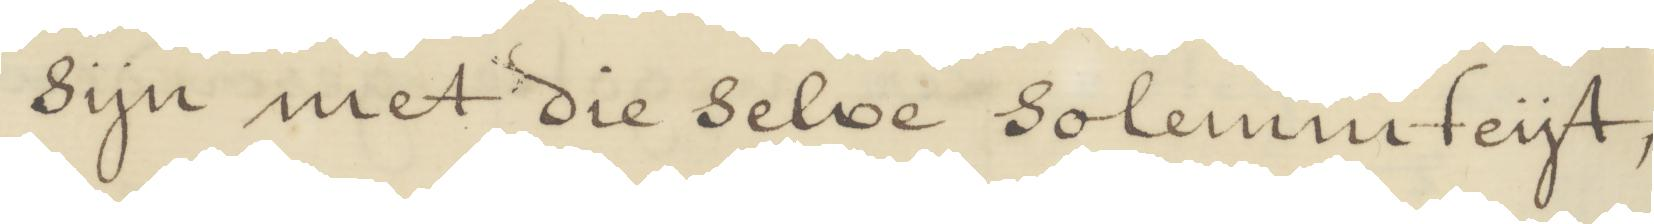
sijn met die selve solemniteijt,
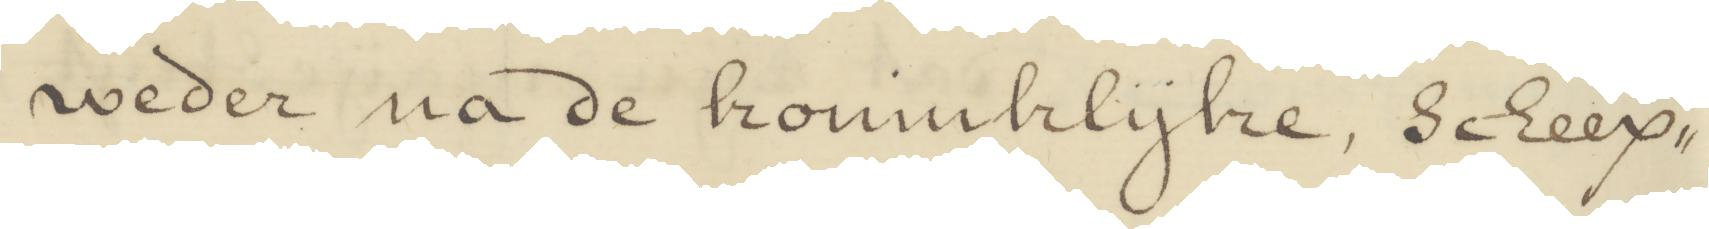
weder na de koninklijke, scheep„
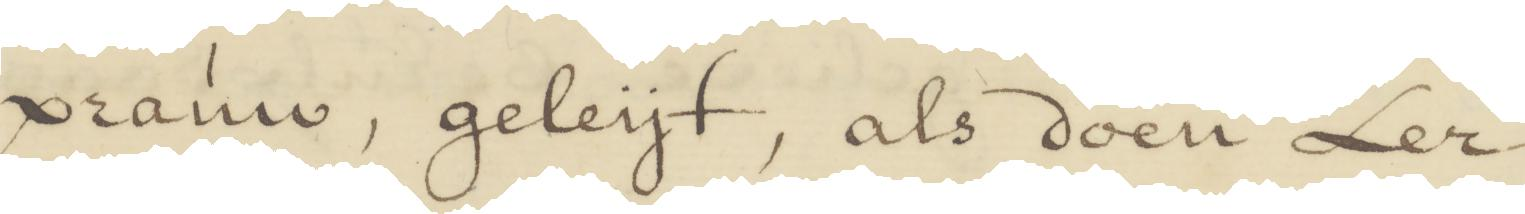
prauw, geleijt, als doen ter
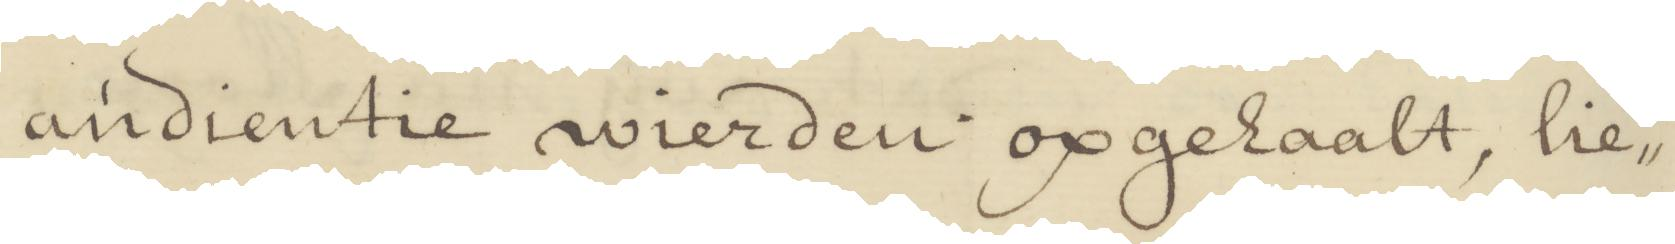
audientie wierden opgehaalt, lie„
